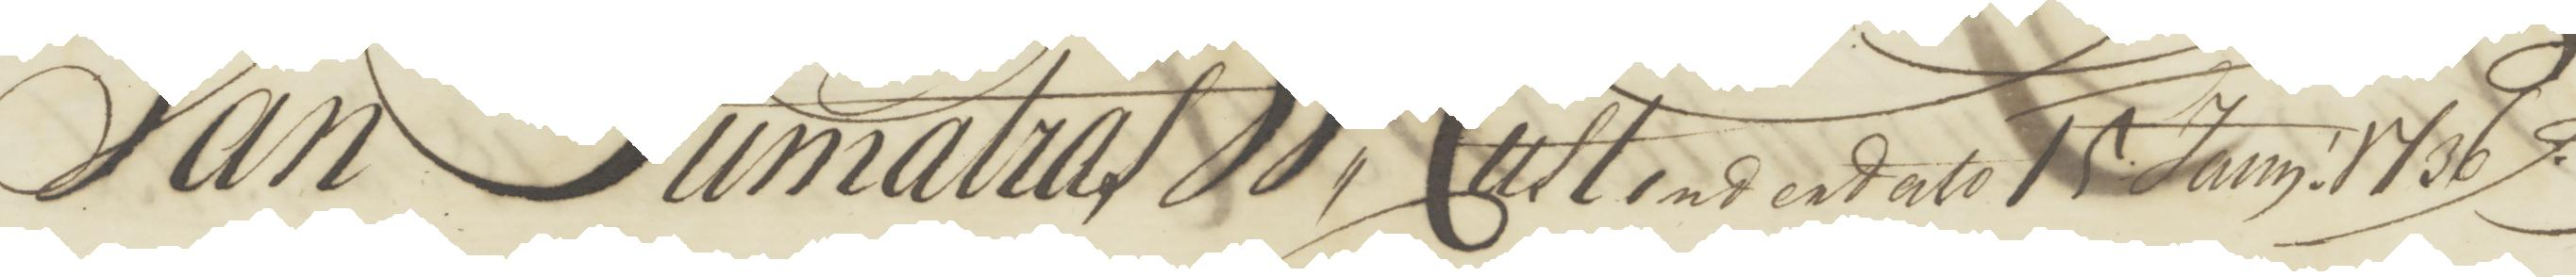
Van Sumatras W„t Cust onder dato 15: Jany: 1736:
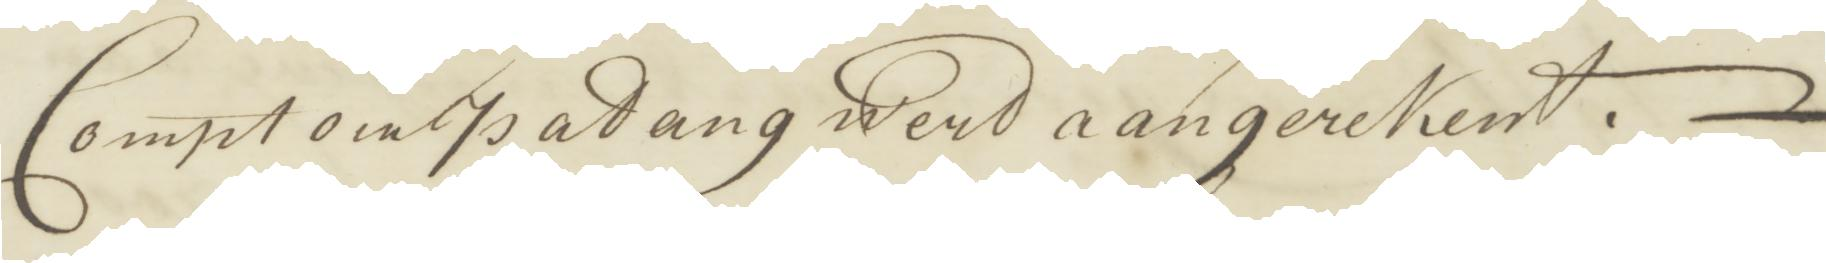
Comptoir Padang werd aangerekent.
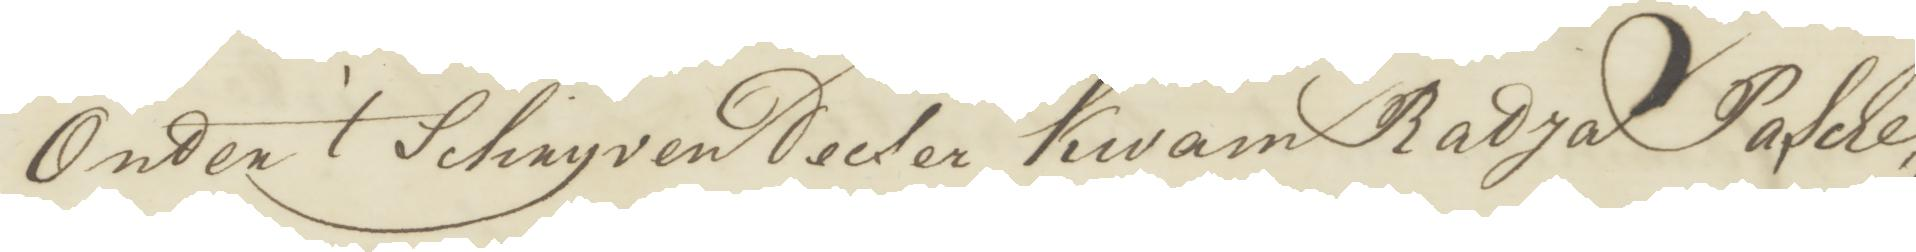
Onder ’t schrijven deeser kwam Radja Pasche„
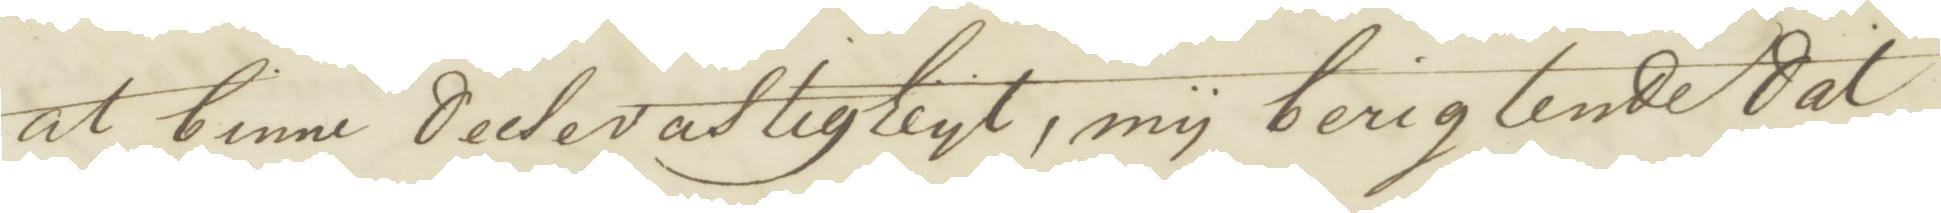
at binne deese vastigheijt, mij berigtende dat
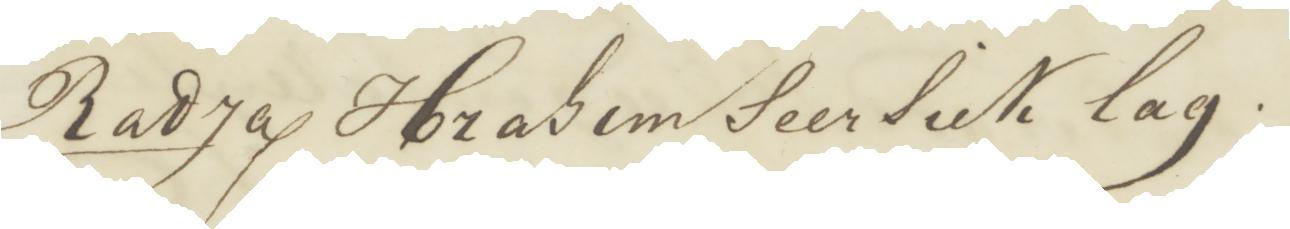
Radja Ibrahim seer siek lag.
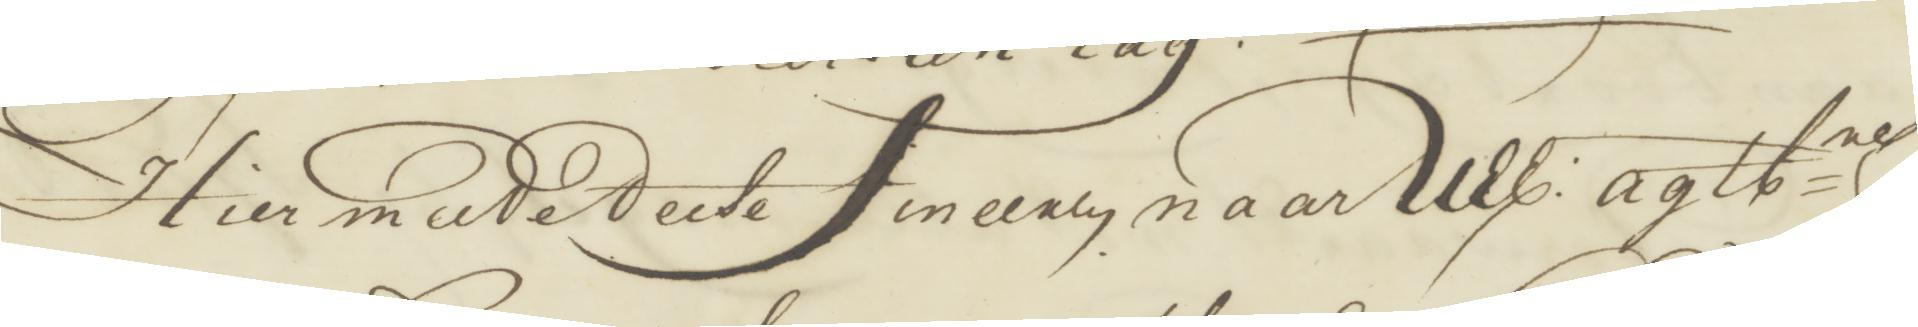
Hier meede deese fineeren naar uEE: agtb=re
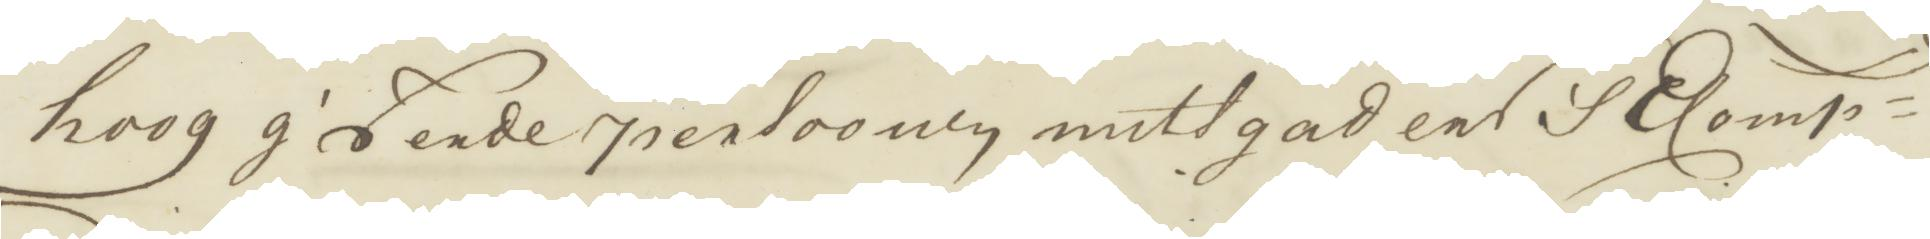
hoog g’Eerde persoonen mitsgaders S EComp=
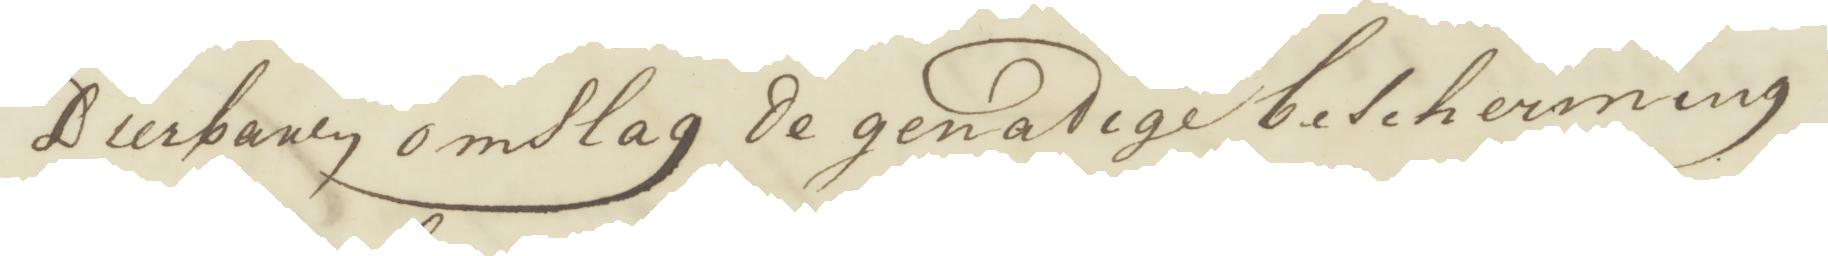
Dierbaren omslag de genadige bescherming
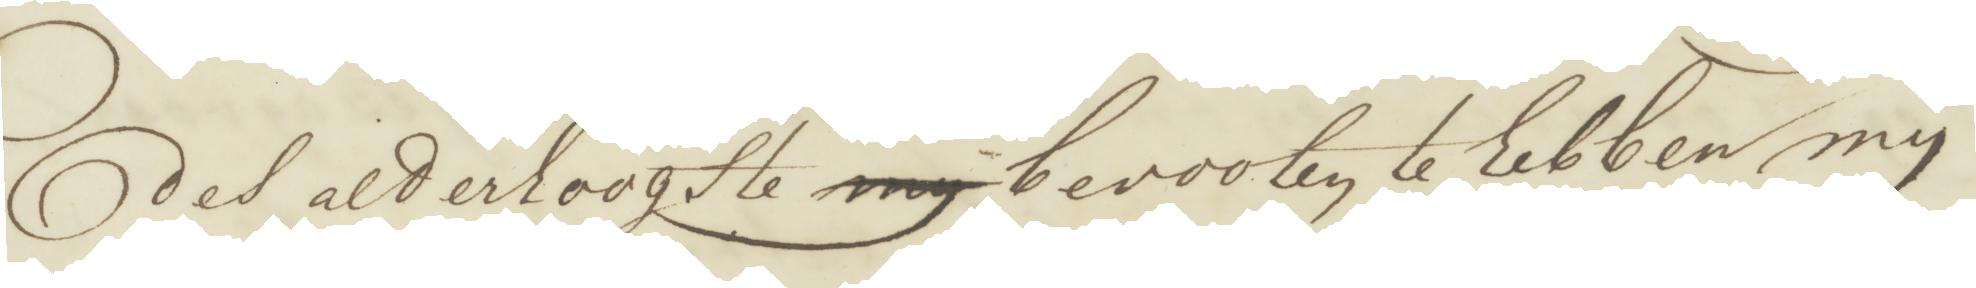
des alderhoogste mij bevoolen te hebben mij
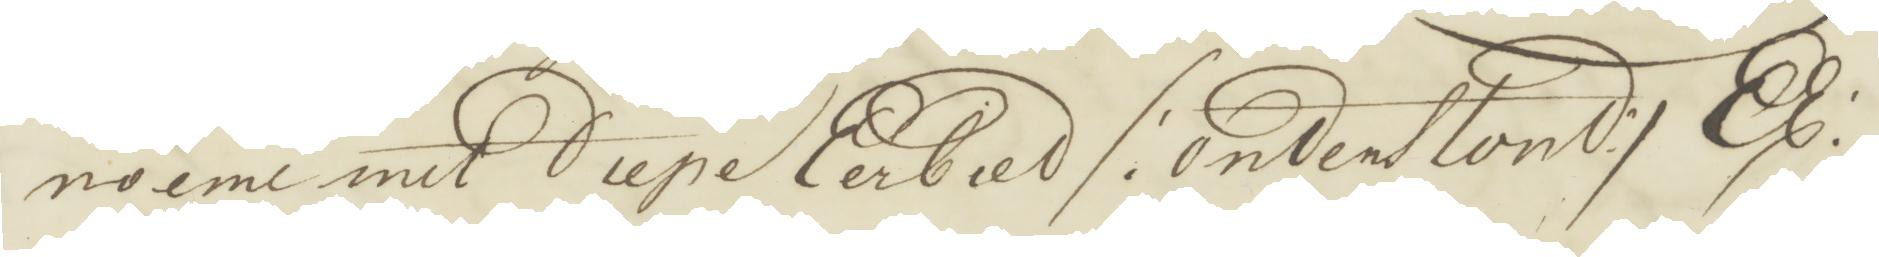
noeme met diepe Eerbed (:onderstond:) EE:
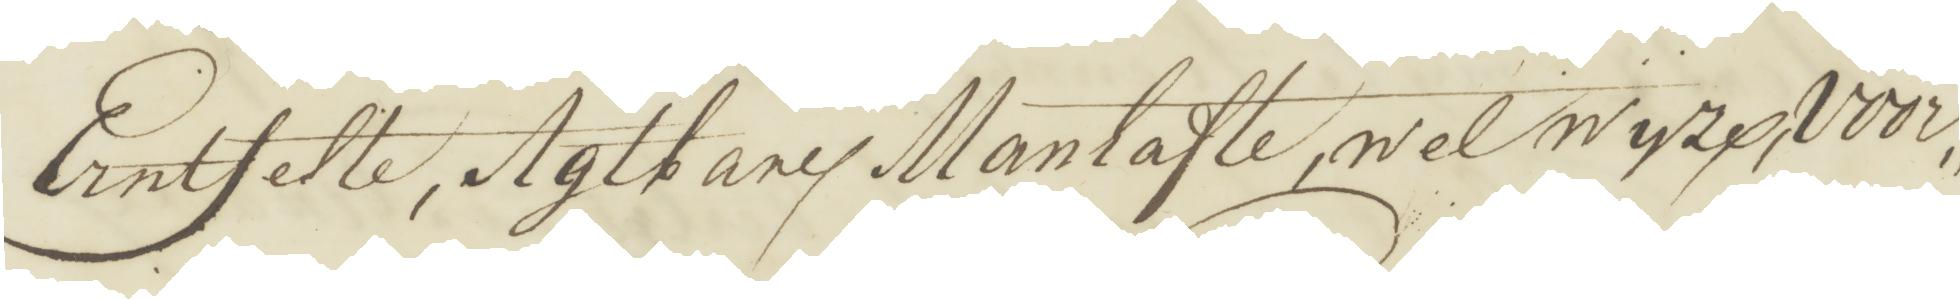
Erntfeste, Agtbare Man hafte, wel wijze, voor„
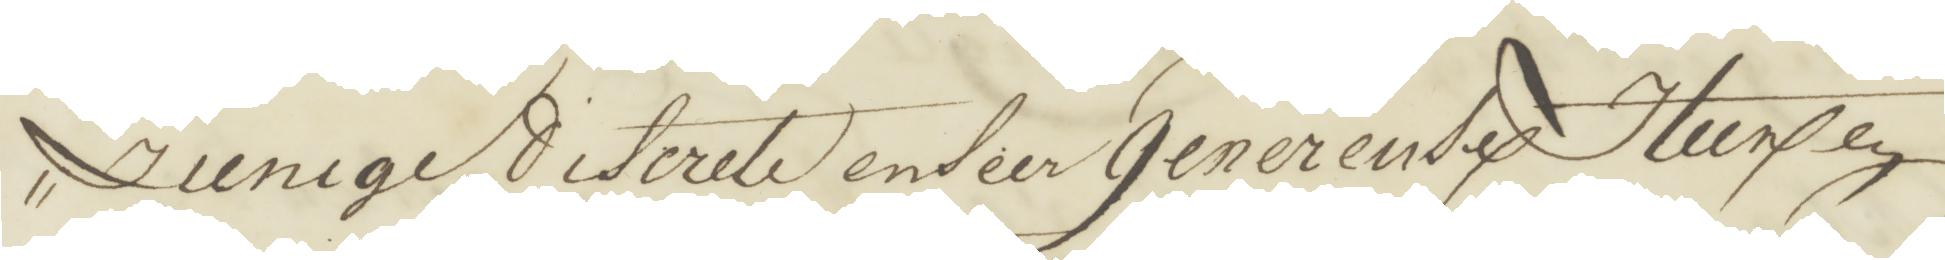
„zienige, discrete en seer genereuse Heeren
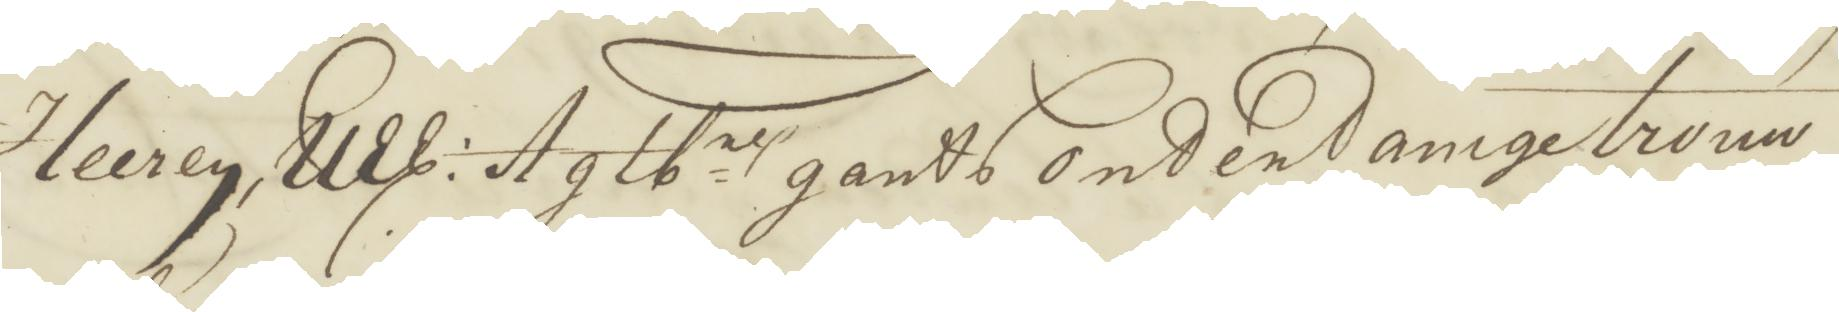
Heeren, UEE: Agtb=re gants onderdanige trouw
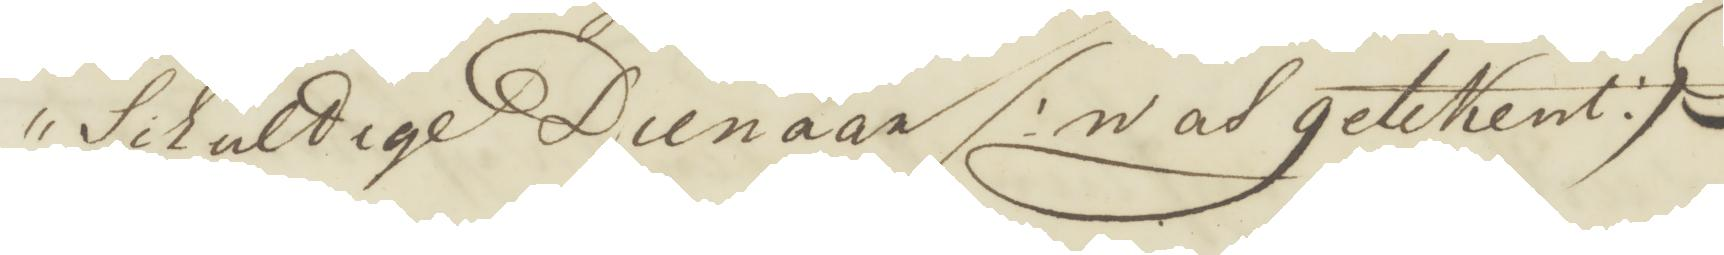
„schuldige Dienaar (:was getekent:)
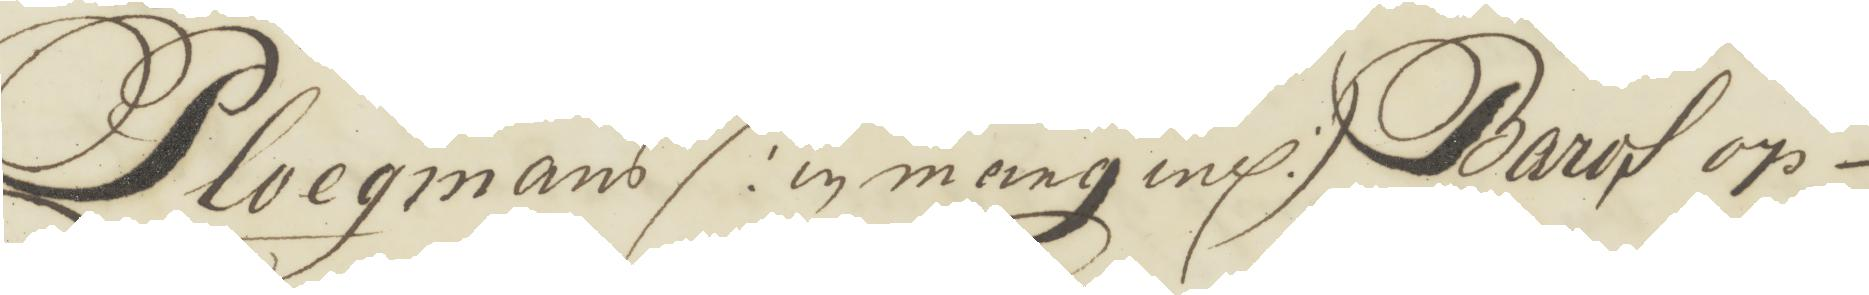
Ploegmans /:in margine:) Baros op _
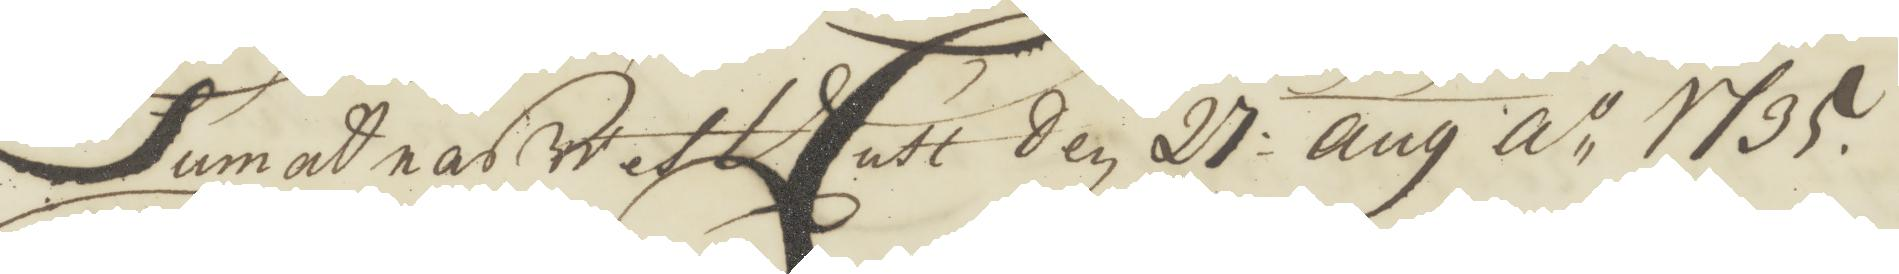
Sumatras west Cust den 27: aug: a„o 1735.
